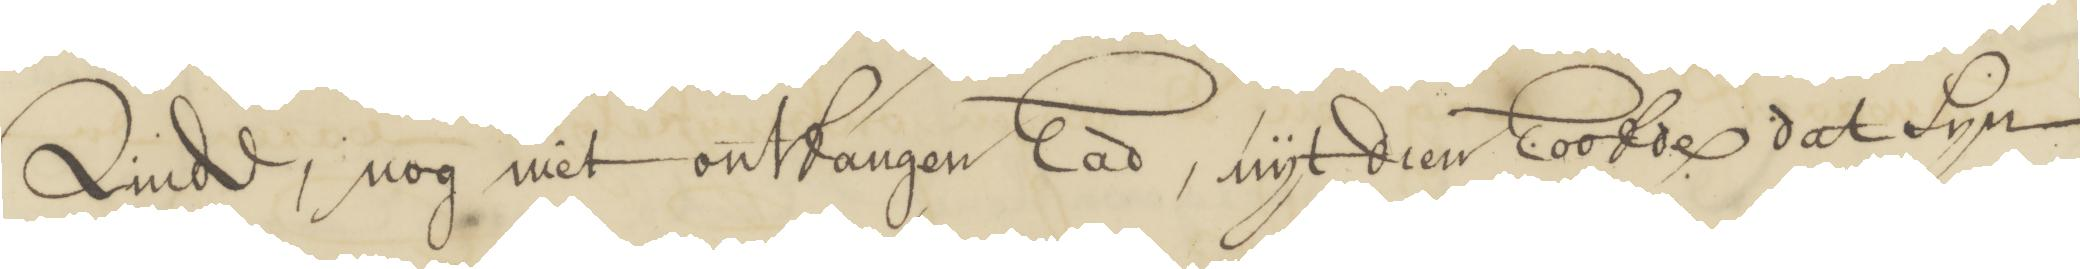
stinde, nog niet ontfangen had, uijt dien hoofde dat syn
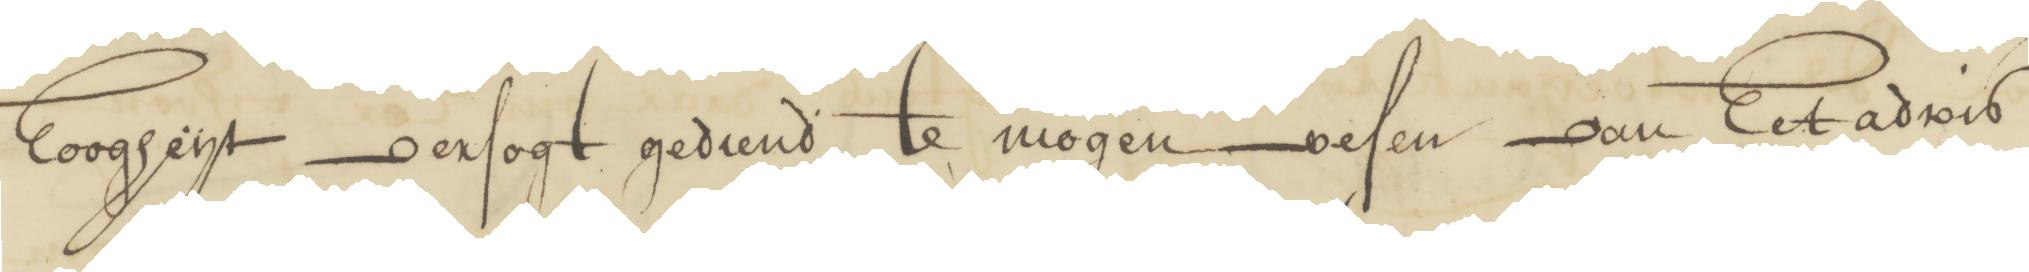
hoogheijt versogt gediend te mogen wesen van het advis
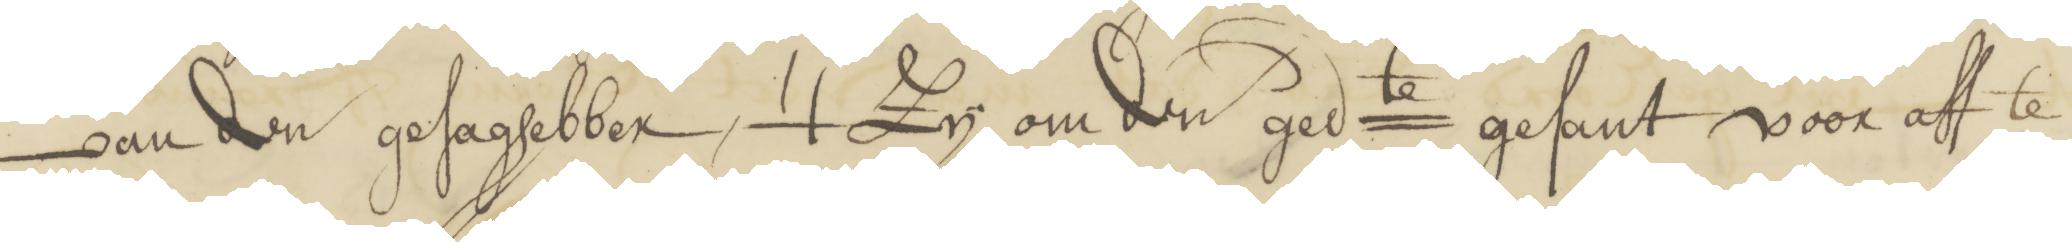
van den gesaghebber, ’t Zij om den ged=te gesant voor aff te
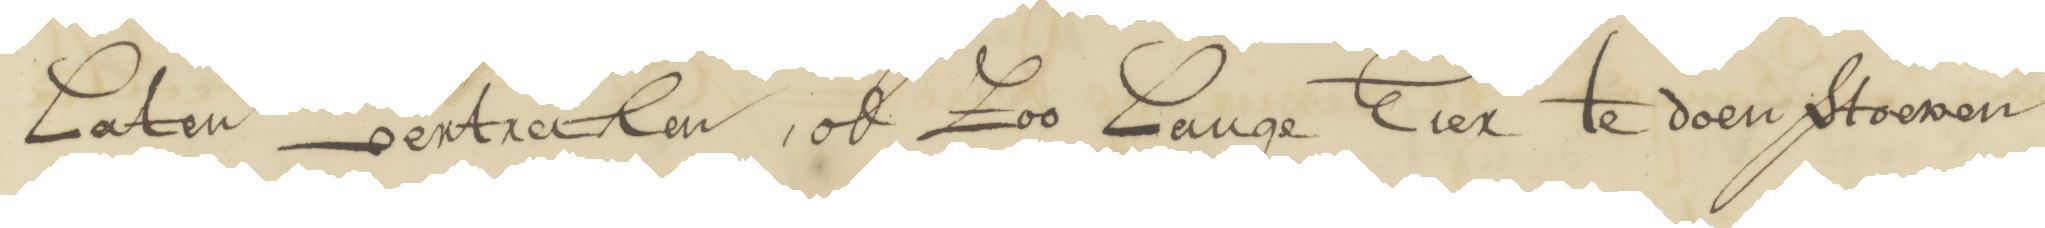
laten vertrecken, of Zoo lange hier te doen vertoeven
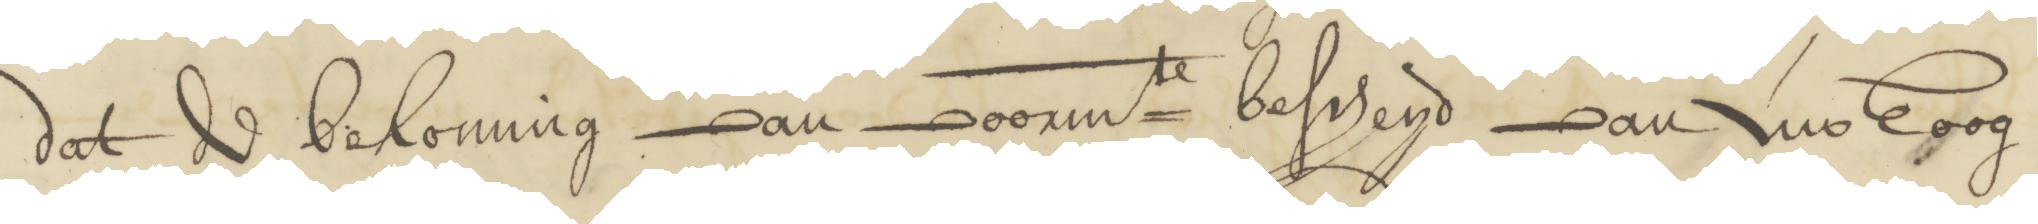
dat de bekoming van voorm=te bescheyd van uw hoog
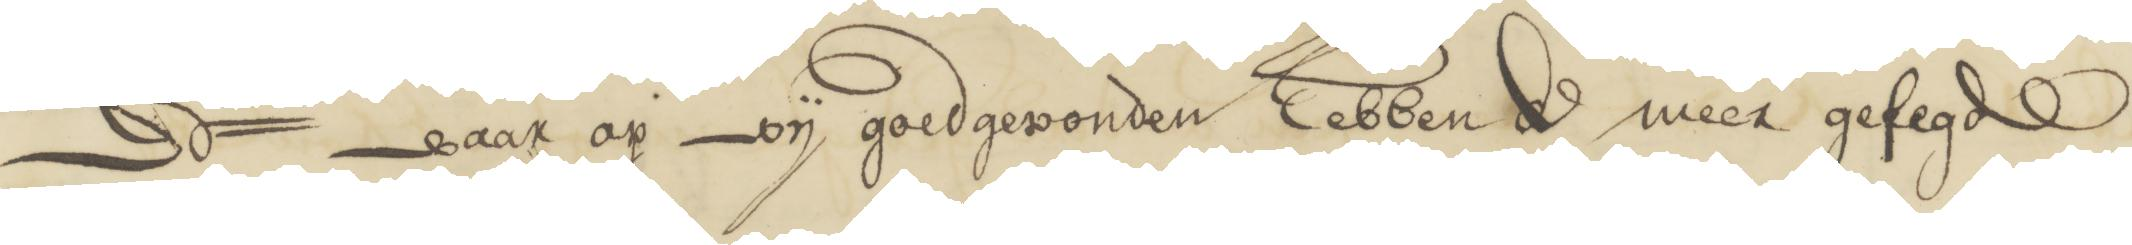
Ed=s waar op wij goedgevonden hebben de meer gesegde
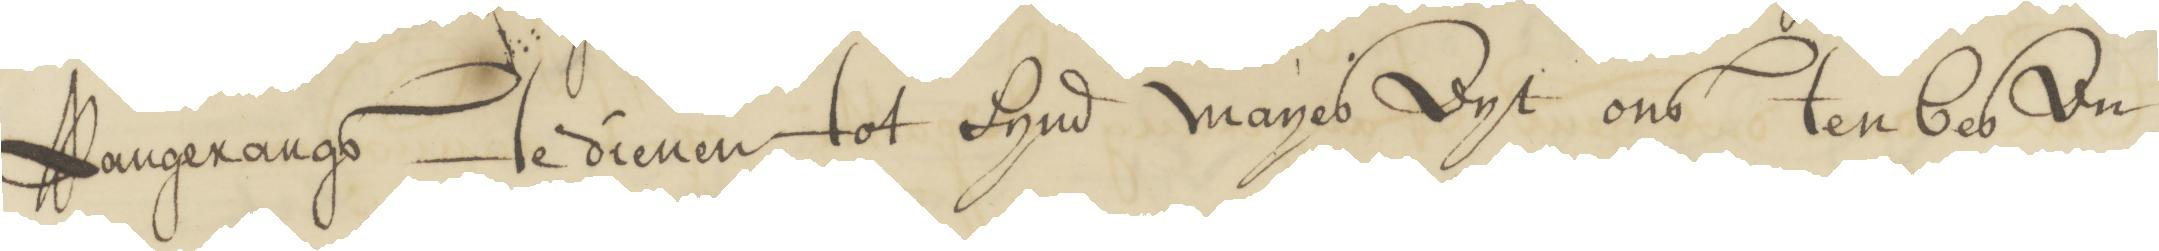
Pangerangs te dienen tot syne maijesteyt ons ten besten
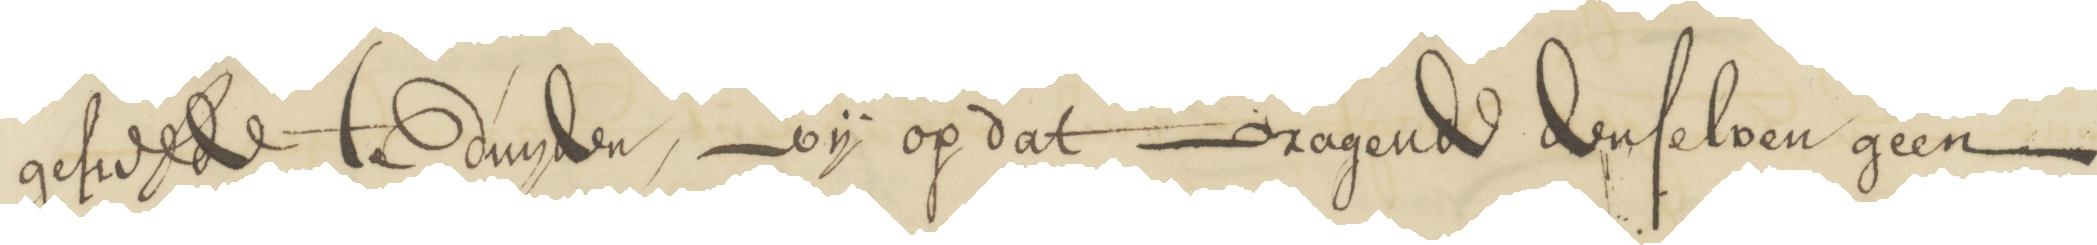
geliefde te duyden, wij op dat vragende denselven geen
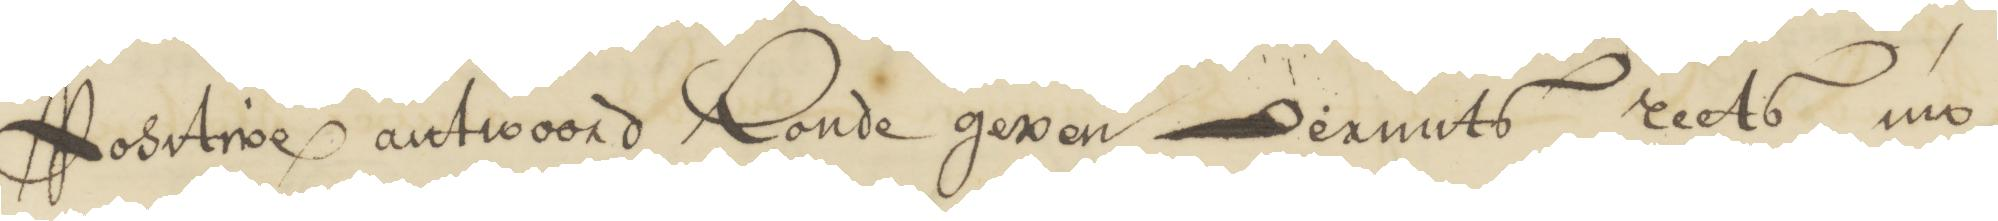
Positive antwoord konde geven vermits reets uw
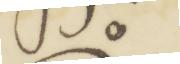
Ho
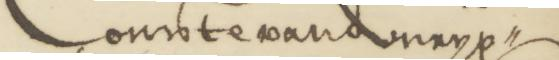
Comste vandenrijx„
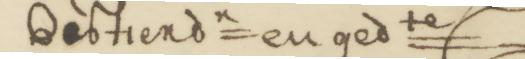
bestierd=r en ged=te
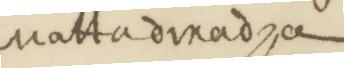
natta diradja
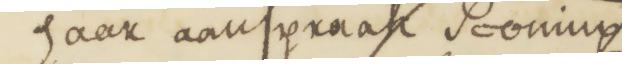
haar aanspraak sconinx
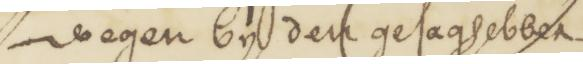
wegen by den gesaghebber
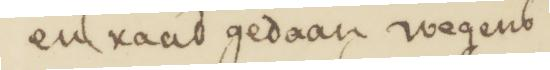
en raad gedaan wegens
